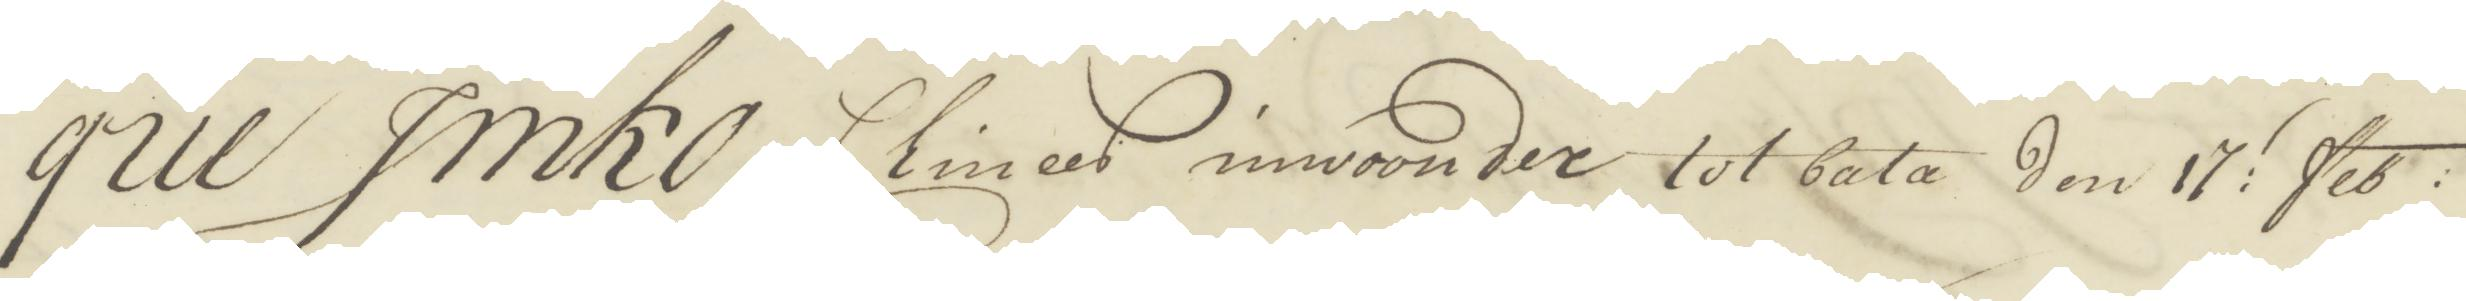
que Jmko Chinees inwoonder tot bata den 17:' feb:
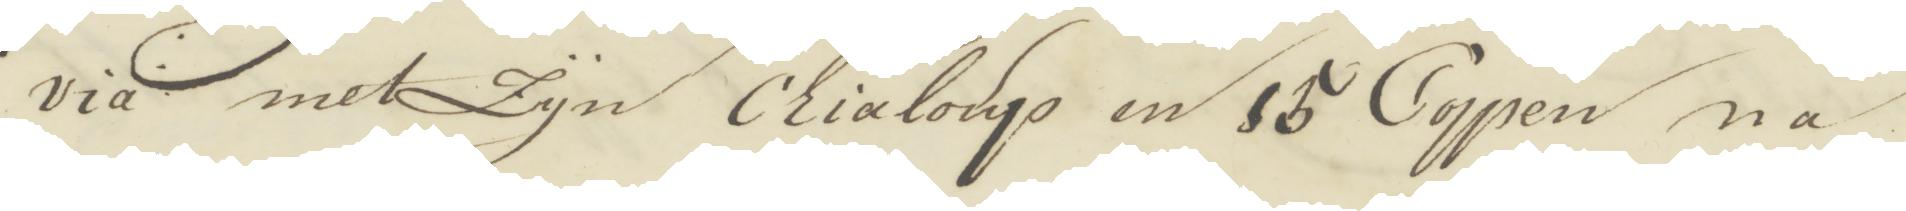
via met zijn Chialoup en 15 Coppen na
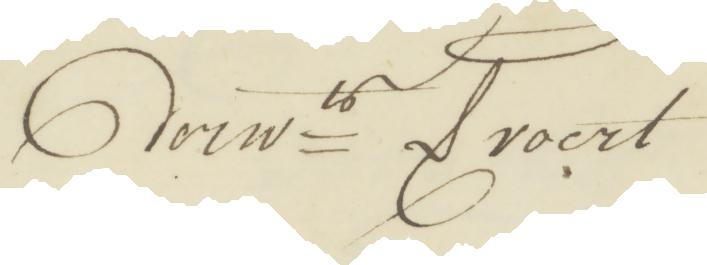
derw=ts vervoert
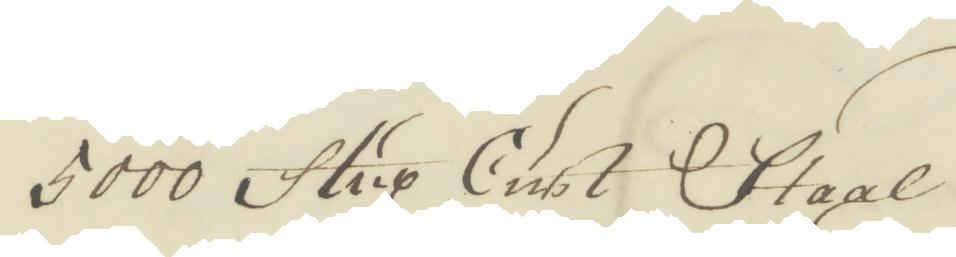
5000 stux Cust Staal
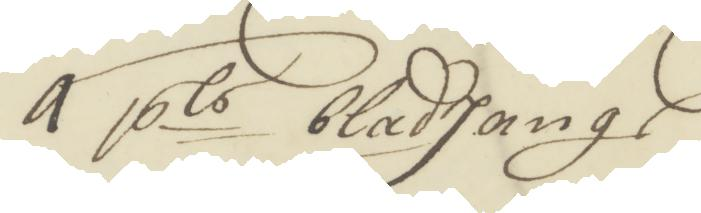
4 p=ls bladjang
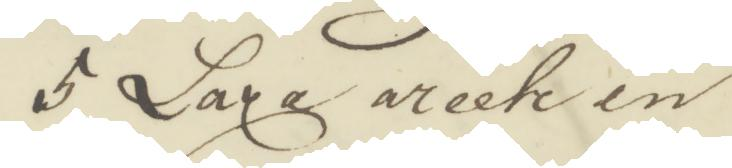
5 Laxa areek en
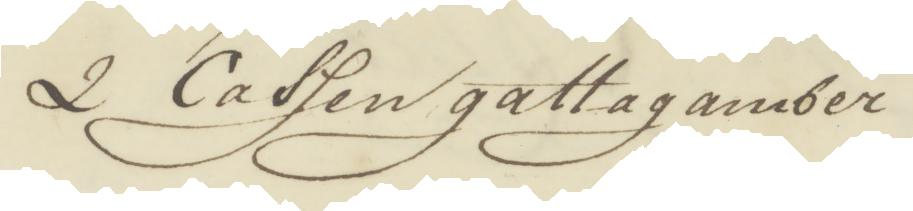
2 Cassen gattagamber
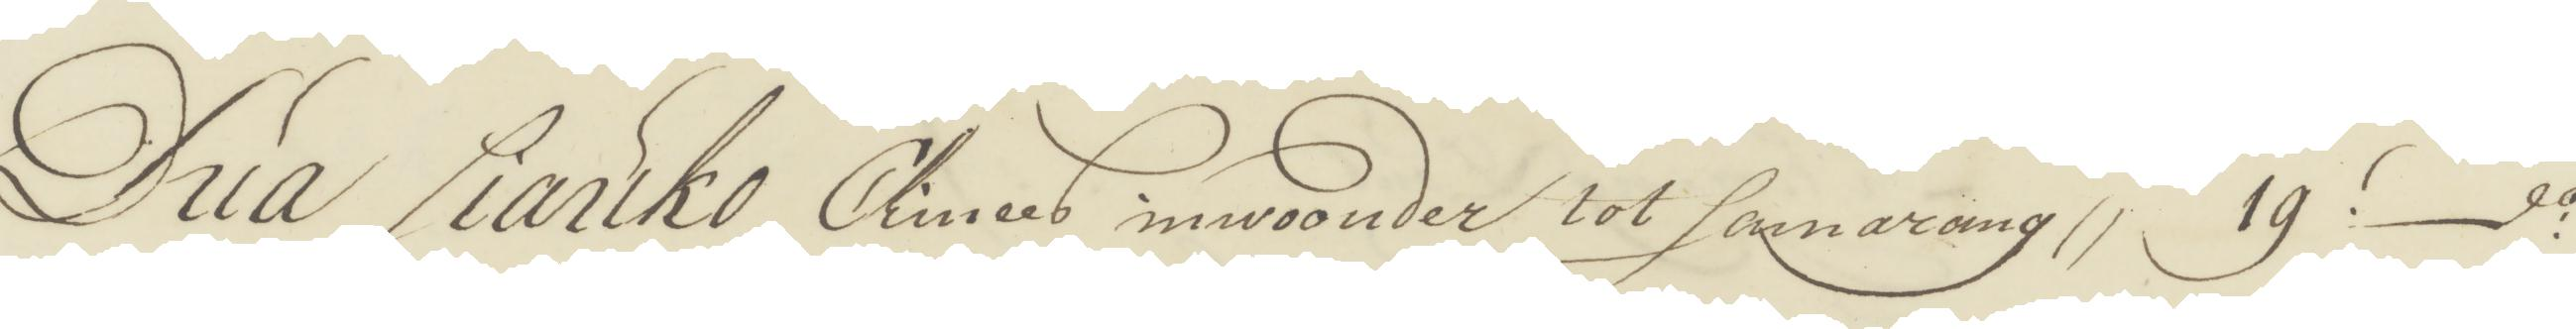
Dua siauko Chinees inwoonder tot Samarang„ 19:' _:o
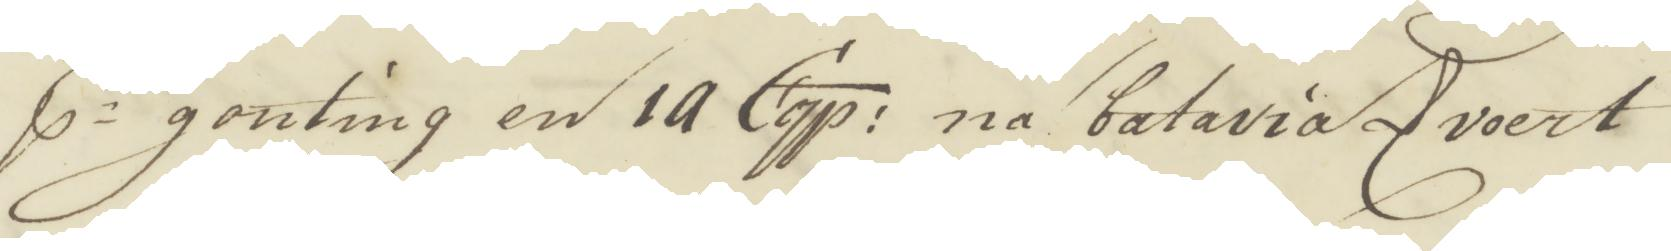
p=r gonting en 14 Copp: na batavia vervoert
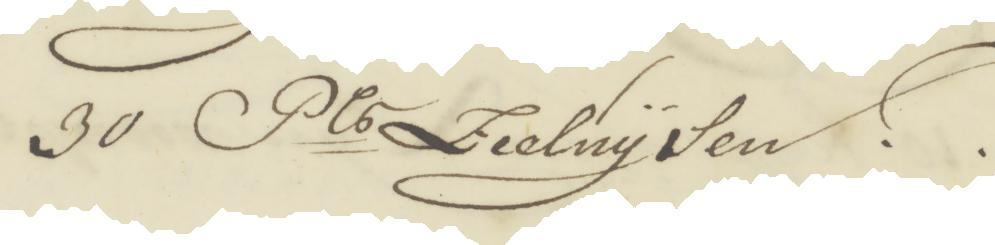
30 P=ls Zeeluijsen . .
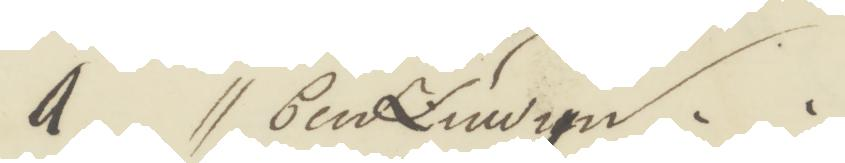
4 „ benzuwijn . .
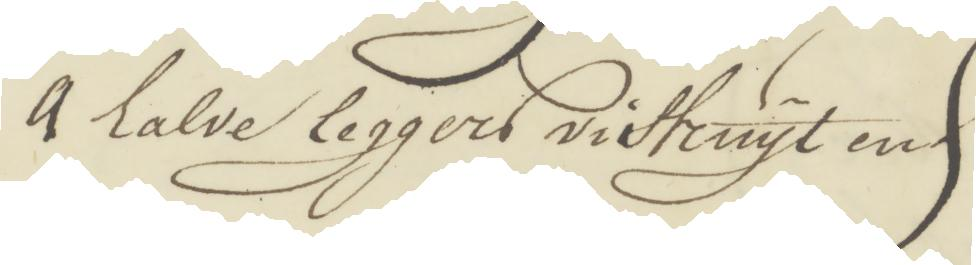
4 halve leggers viskuijt en
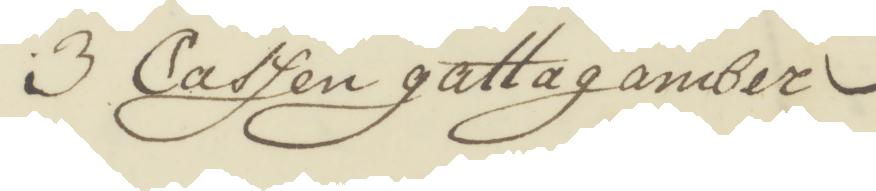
3 Cassen gattagamber
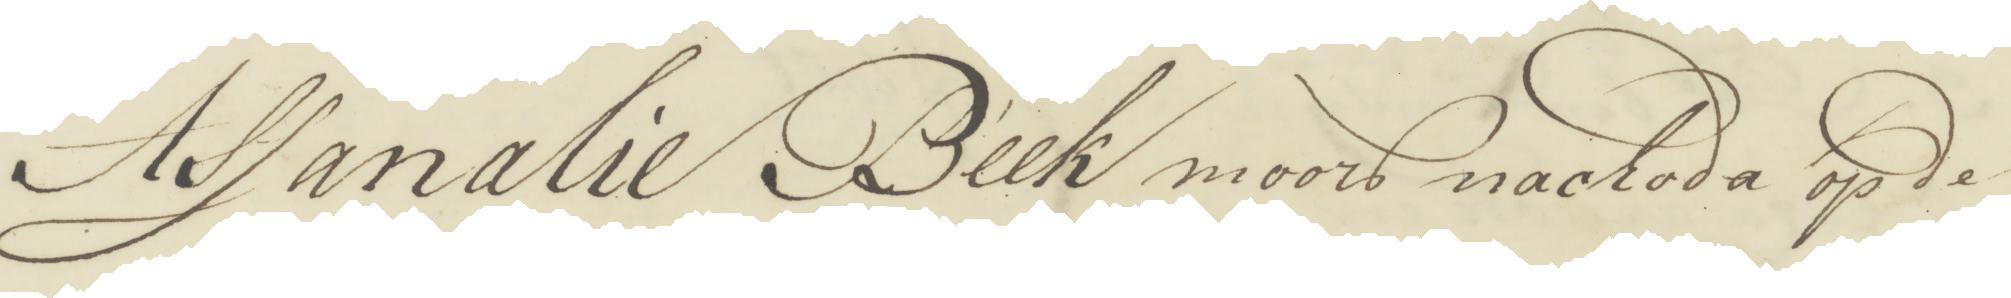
Assanalie Beek moors nachoda op de
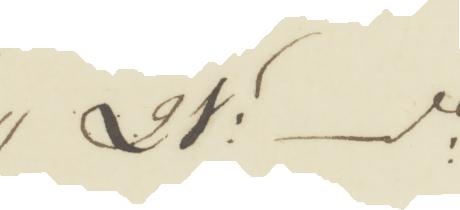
„ 21:' _:o
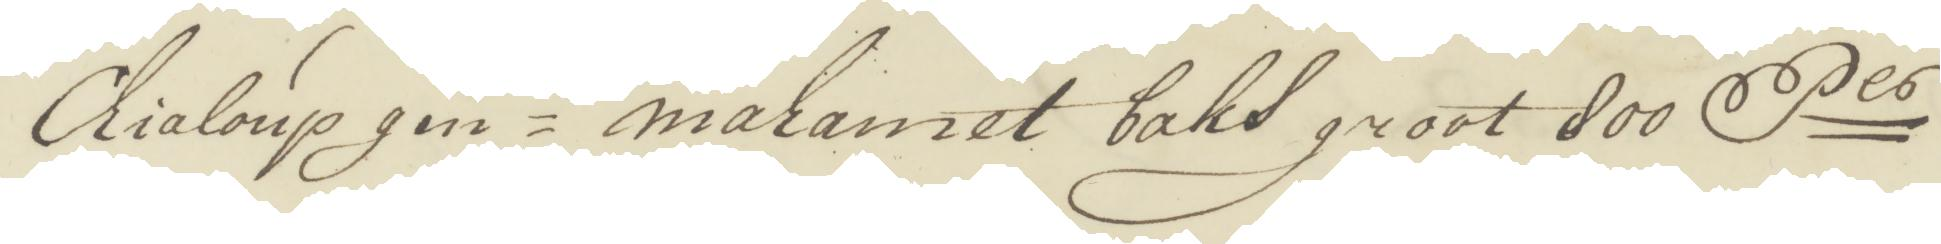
Chialoup gen=t mahamet baks groot 8oo P=ls
